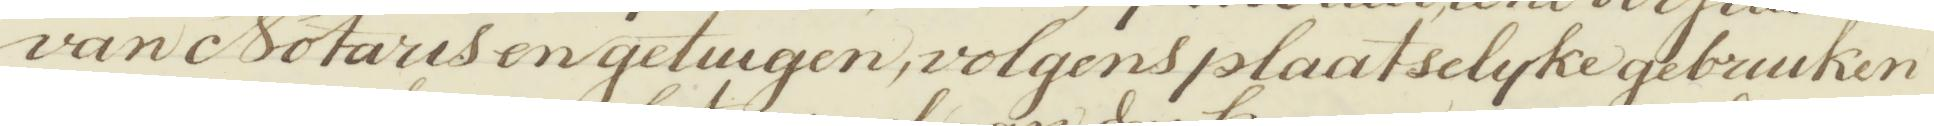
van Notaris en getuigen, volgens plaatselyke gebruiken
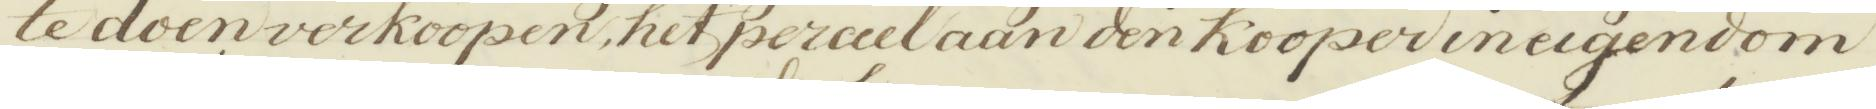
te doen verkoopen, het perceel aan den kooper in eigendom
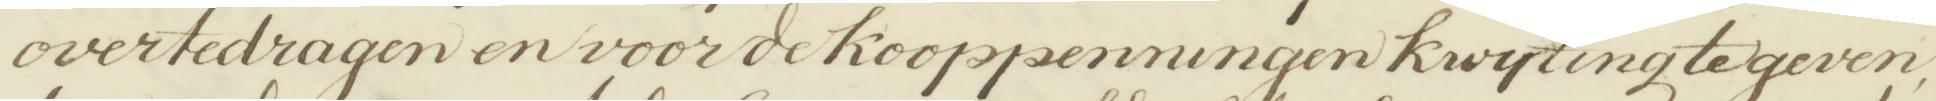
over te dragen en voor de Kooppenningen kwyting te geven,
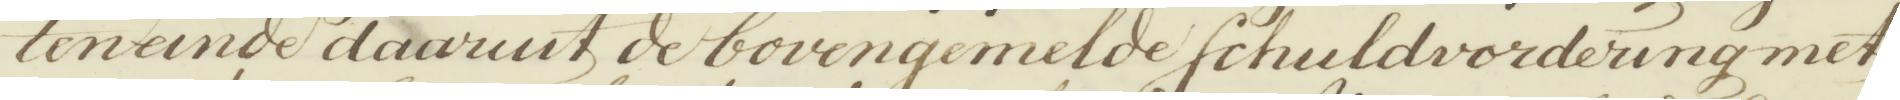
ten einde daaruit de bovengemelde schuldvordering met
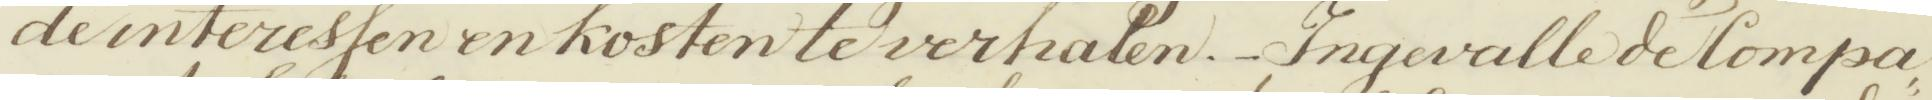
de interessen en kosten te verhalen. - Ingevalle de Compa
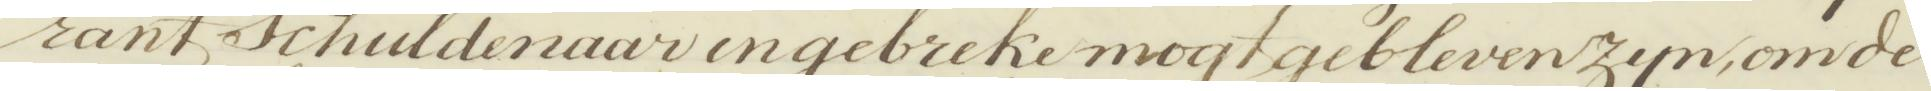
rant Schuldenaar in gebreke mogt gebleven zyn, om de
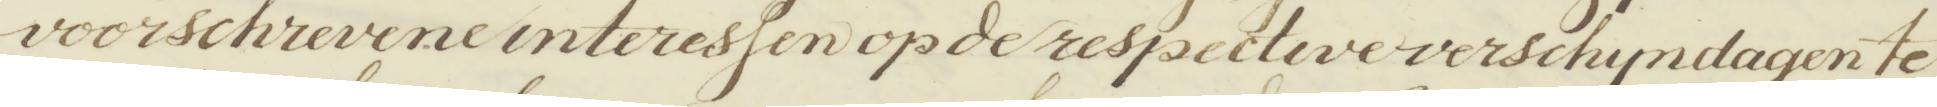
voorschrevene interessen op de respective verschyndagen te
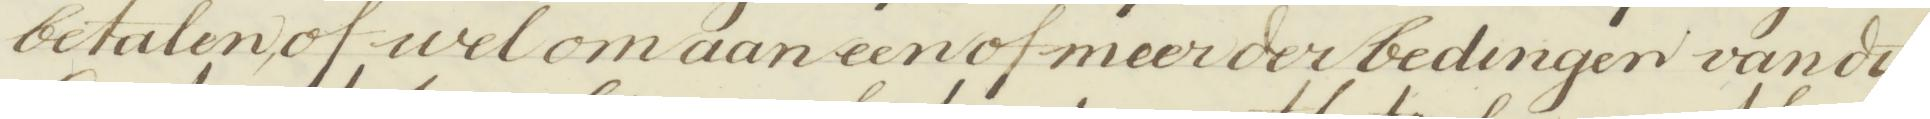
betalen, of wel om aan een of meerder bedingen van dit
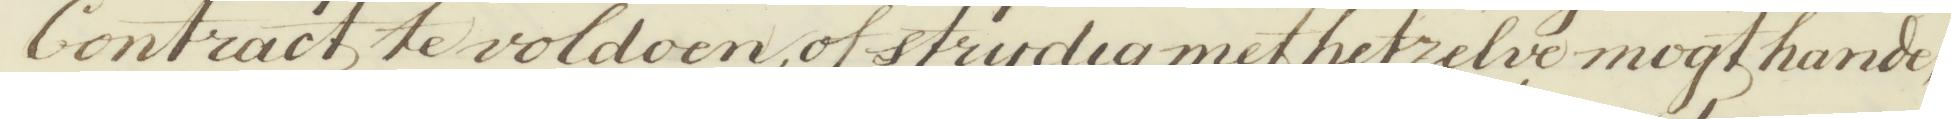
Contract, te voldoen, of strydig met hetzelve mogt hande„
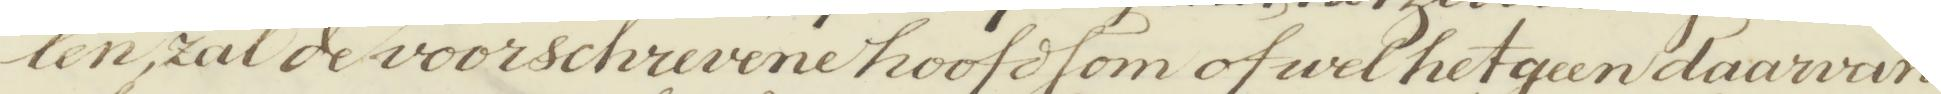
len, zal de voorschrevene hoofdsom of wel het geen daarvan
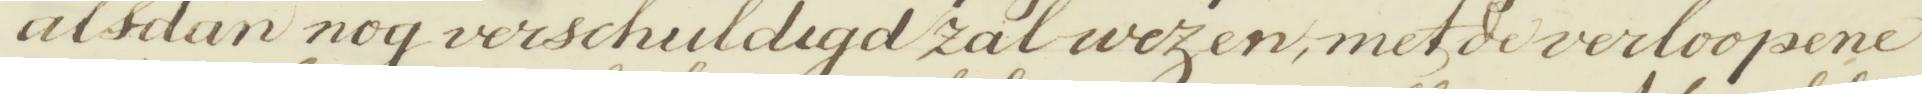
alsdan nog verschuldigd zal wezen, met de verloopene
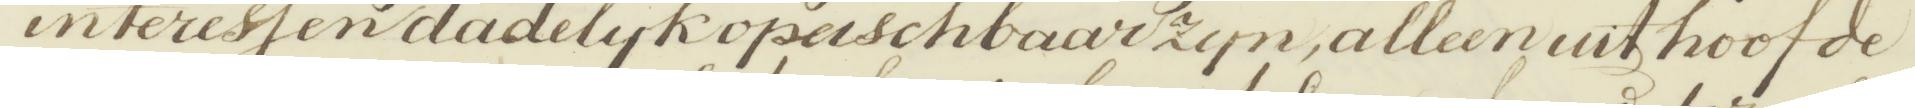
interessen dadelyk opeischbaar zyn, alleen uit hoofde
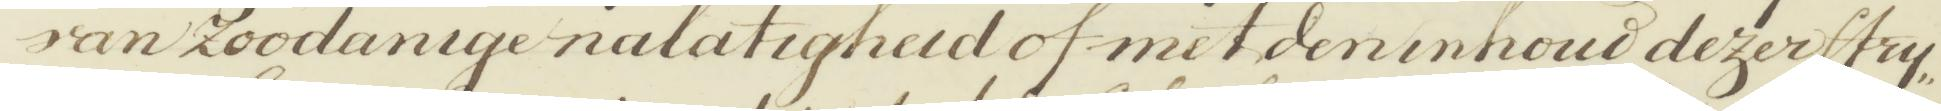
van zoodanige nalatigheid of met den inhoud dezer Stry„
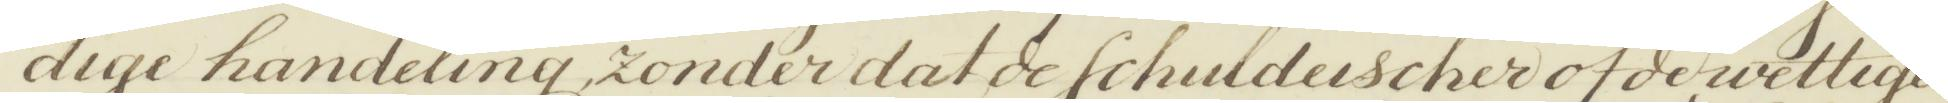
dige handeling, zonder dat de Schuldeischer of de wettige
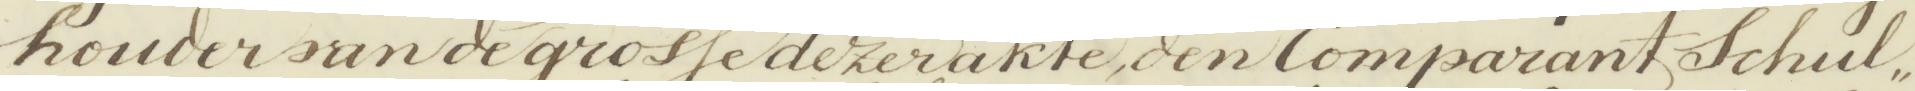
houder van de grosse dezer akte, den Comparant Schul„
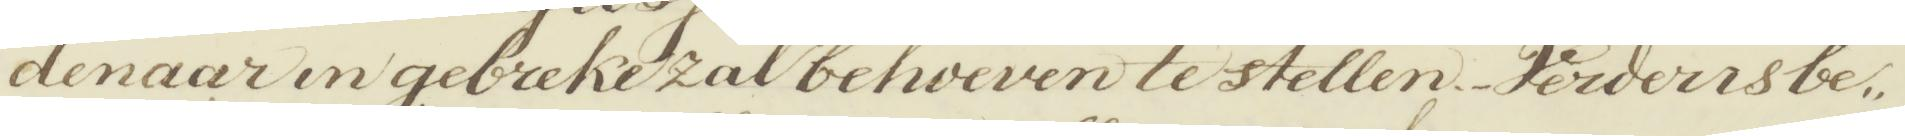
denaar in gebreke zal behoeven te stellen. - Verder is be„
